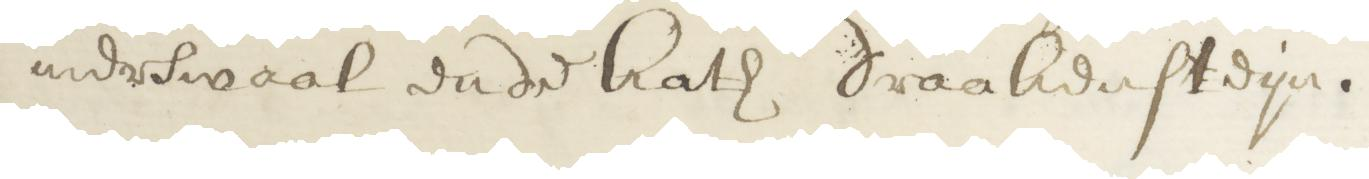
merswaal en de kath draakensteijn.
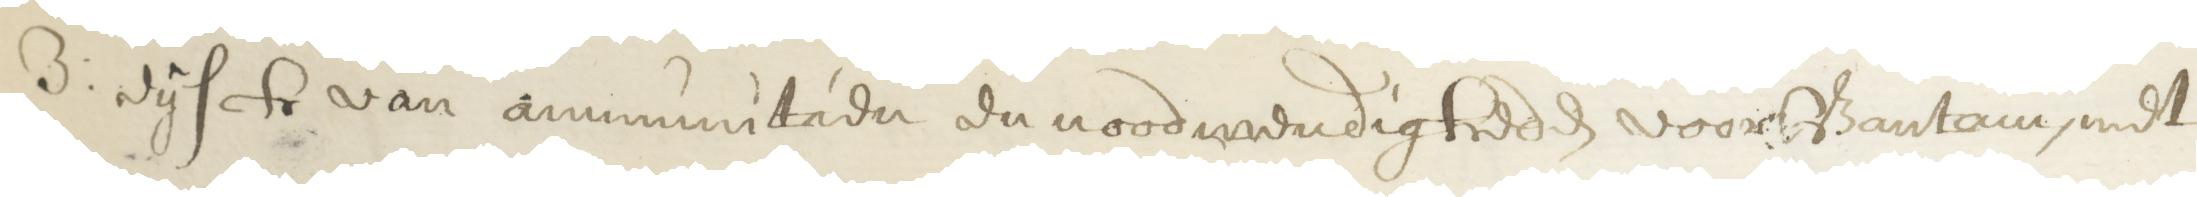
3: eijsch van ammunitien en noodwendigheden voor Bantam, met
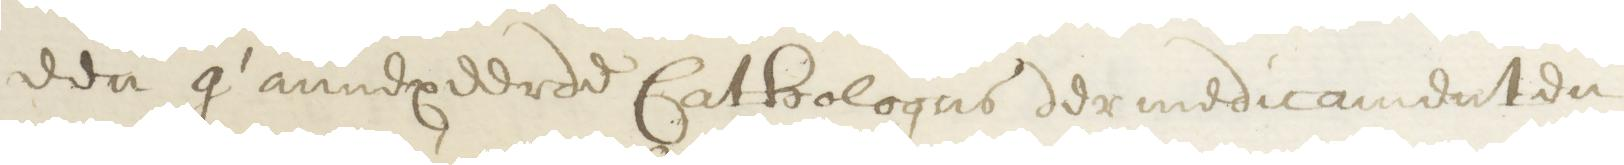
een g’annexeerde Cathologus der medicamenten
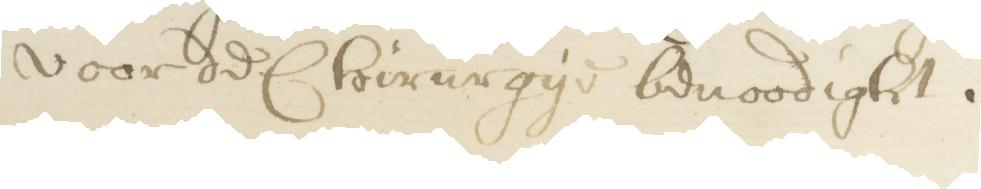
voor de Chirurgije benoodight.
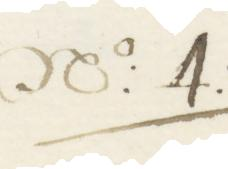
N:o 4:
